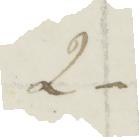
2_
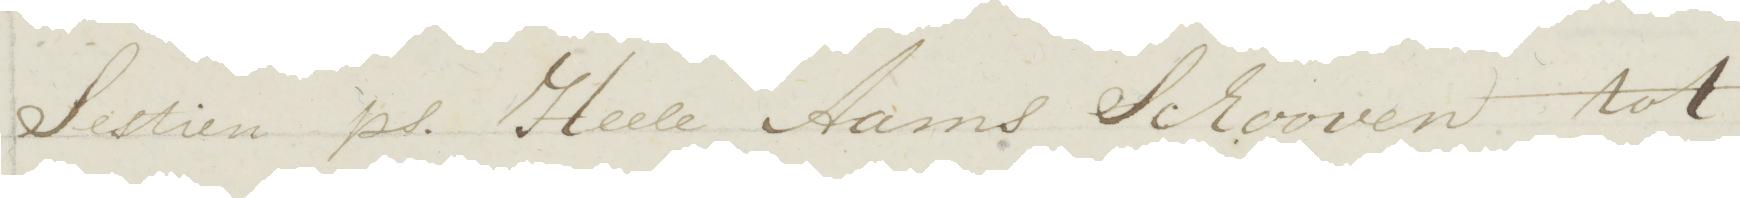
Sestien ps. Heele Aams schooven tot
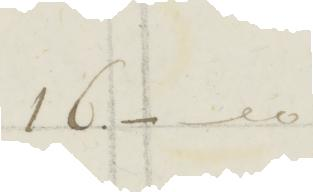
16._ _o
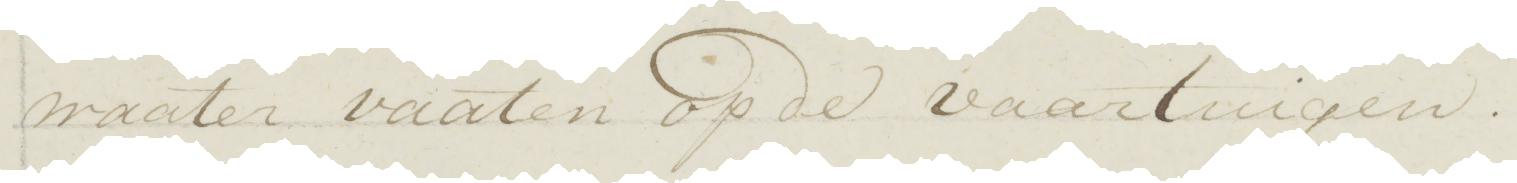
waater vaaten op de vaartuigen.
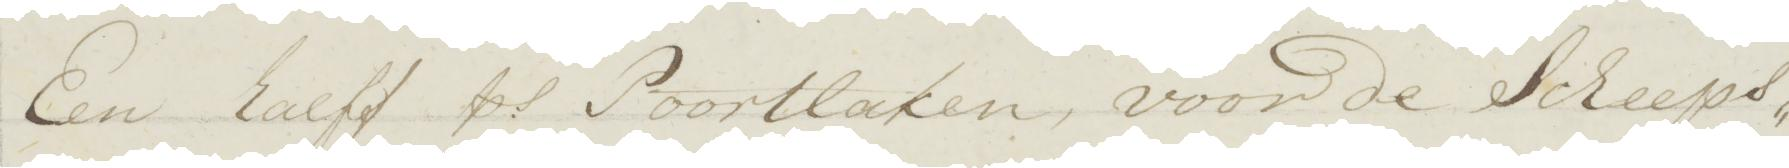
Een haeft p.s Poortlaken, voor de scheeps„
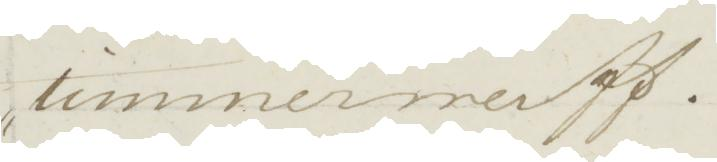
„timmerwerff.
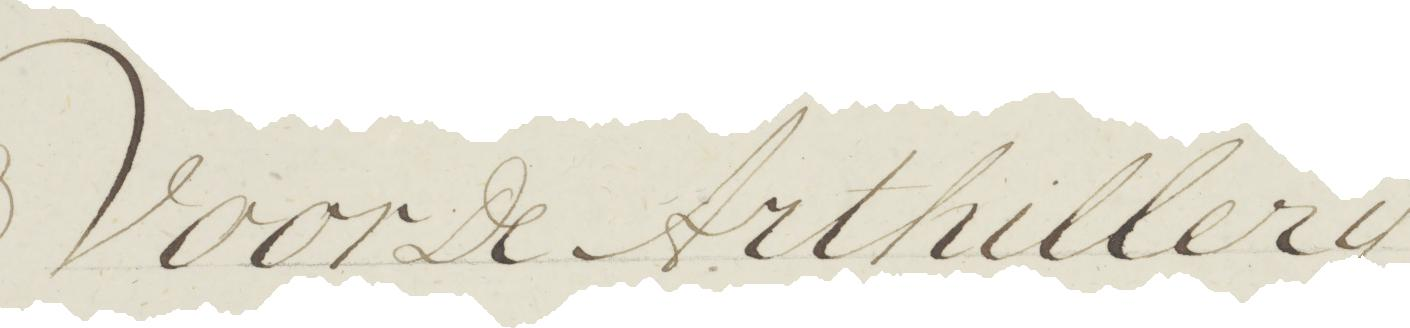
Voor de Arthillerij
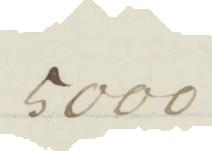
5000
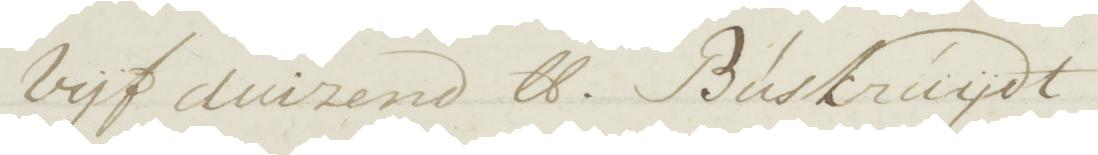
vijf duizend lb. Buskruijdt
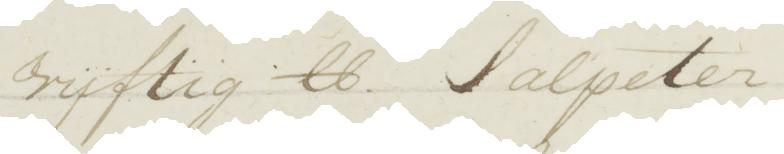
vijftig lb. salpeter
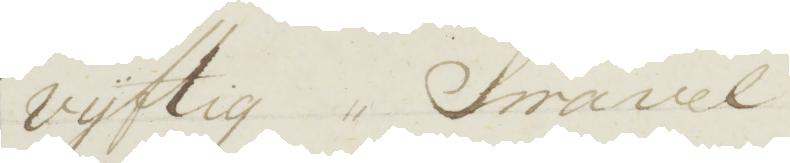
vijftig „ swavel
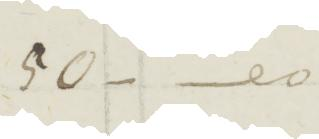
50_ _o
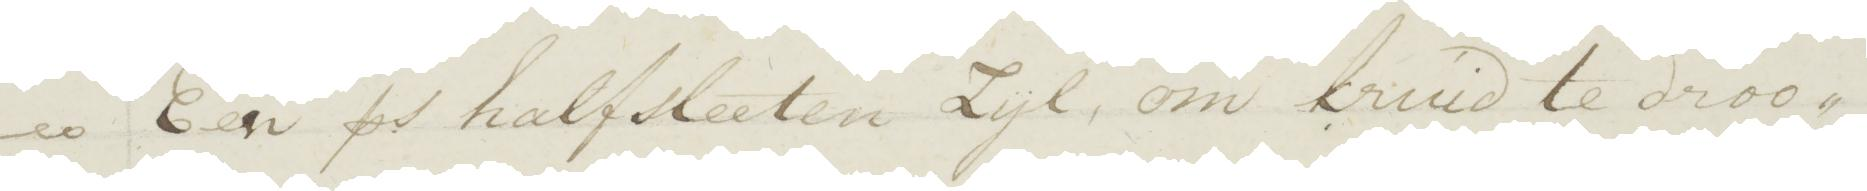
_o Een p.s halfsleeten zijl, om kruid te droo„
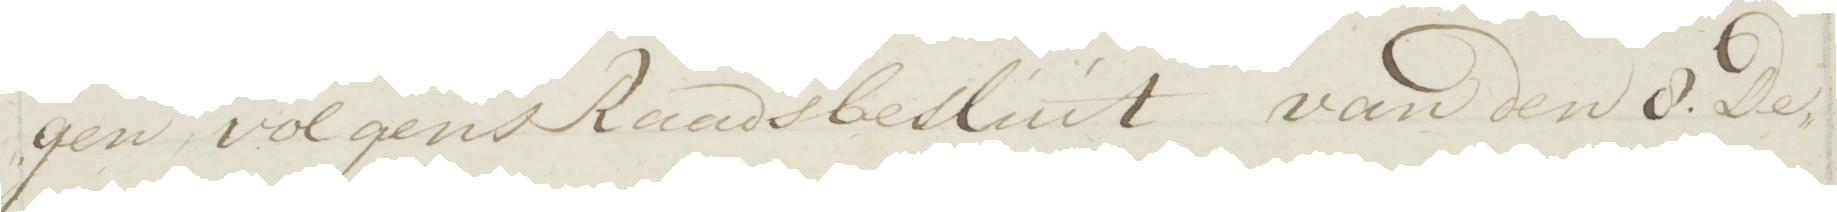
„gen, volgens Raadsbesluit van den 8. De„
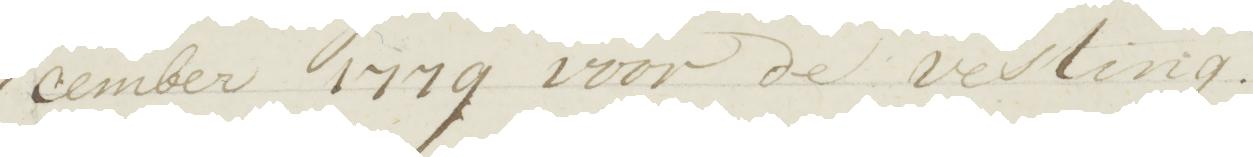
cember 1779 voor de vesting.
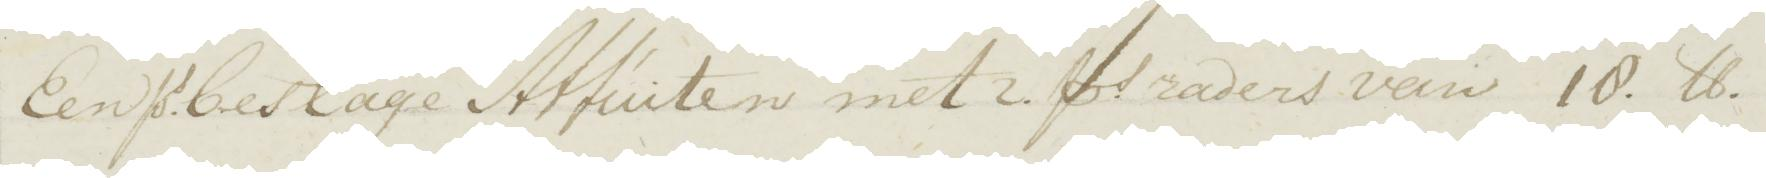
Een p.s beslage Affuiten met 2. p.s raders van 18. lb.
